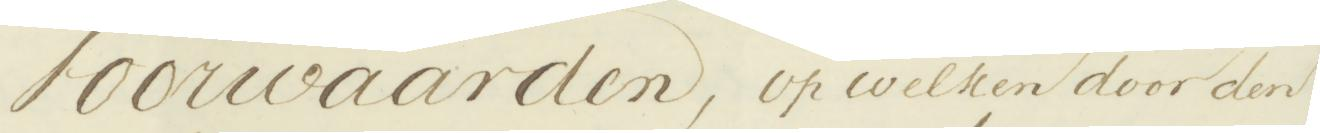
Voorwaarden, op welken door den
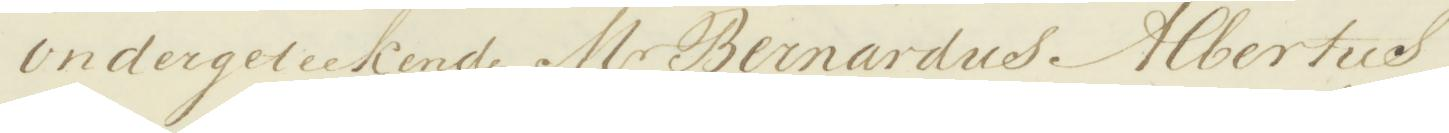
ondergeteekende Mr Bernardus Albertus
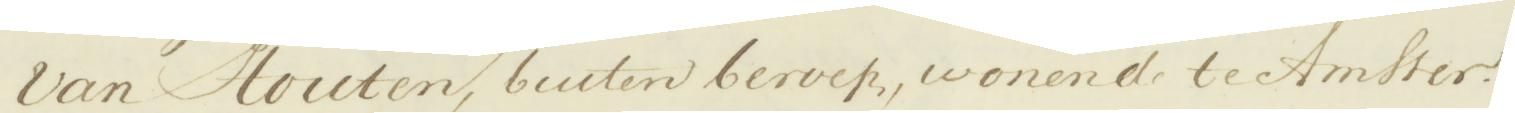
van Houten, buiten beroep, wonende te Amster.
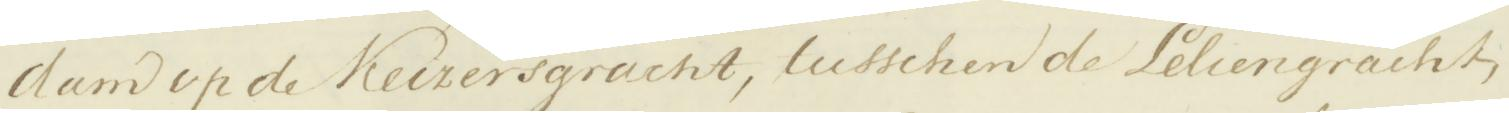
dam op de Keizersgracht, tusschen de Leliengracht
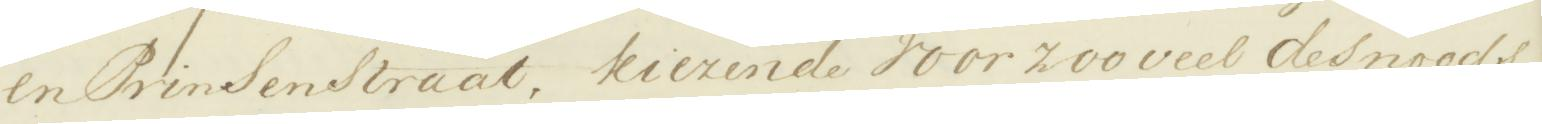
en Prinsenstraat, kiezende voor zoo veel des noods
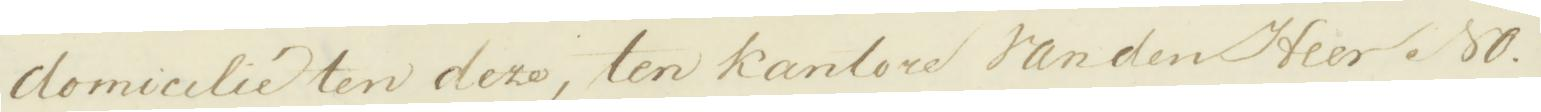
domicilie ten deze, ten kantore van den Heer No.
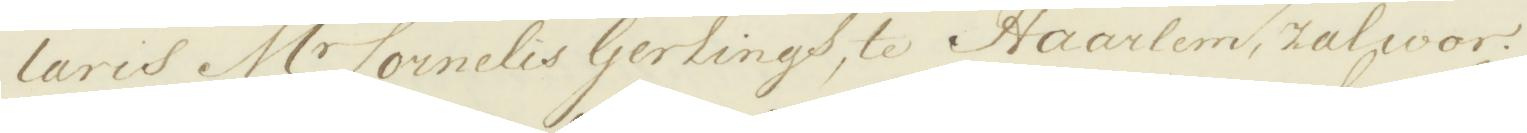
taris Mr Cornelis Gerlings, te Haarlem, zal wor.
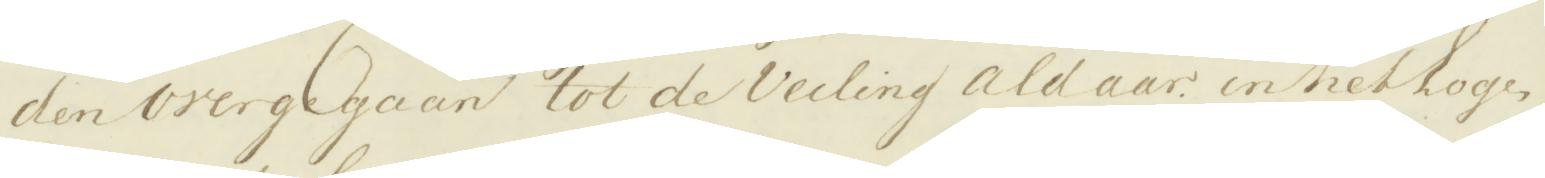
den overgegaan tot de Veiling aldaar in het Loge
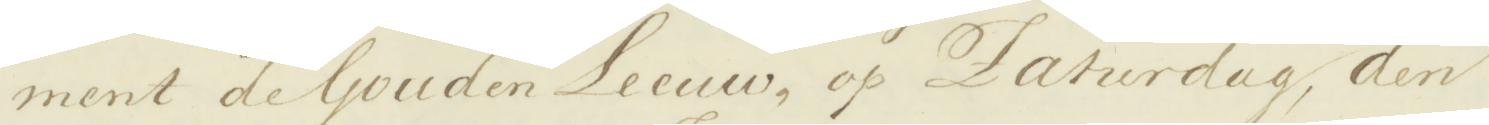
ment de Gouden Leeuw, op Zaturdag, den
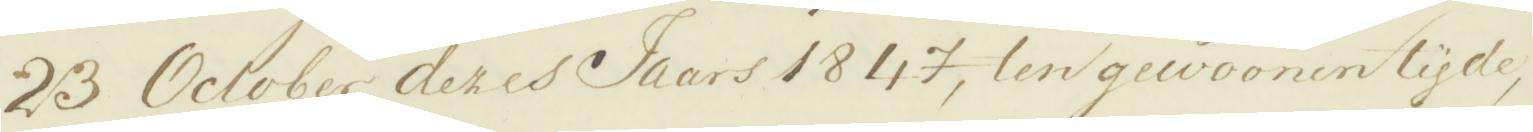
23 October, dezes Jaars 1847, ten gewoonen tijde,
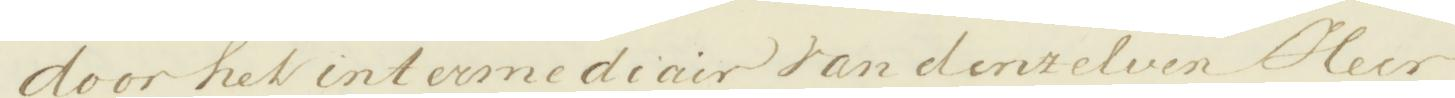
door het intermediair van denzelven Heer
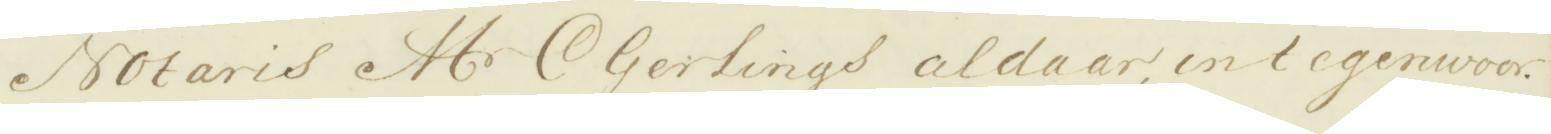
Notaris Mr C Gerlings aldaar, in tegenwoor.
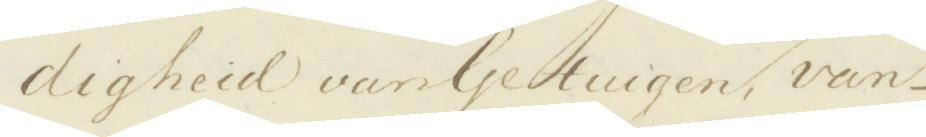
digheid van Getuigen, van
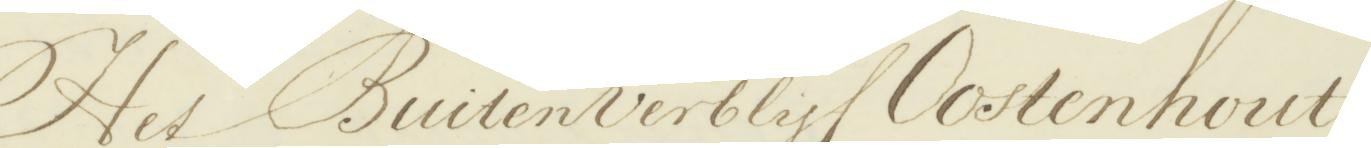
Het Buiten verblijf Oostenhout,
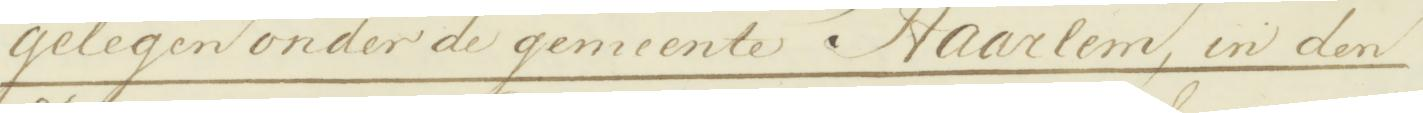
gelegen onder de gemeente Haarlem, in den
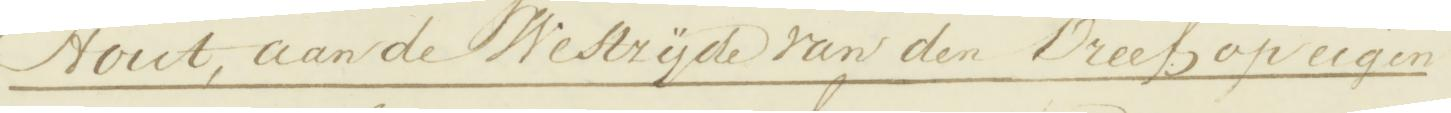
Hout, aan de Westzijde van den Dreef op eigen
